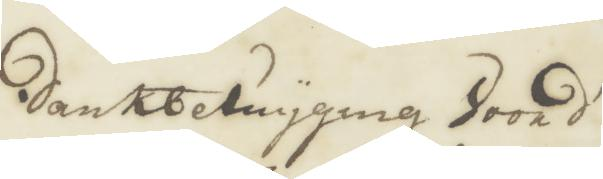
dankbetuijging voor d’
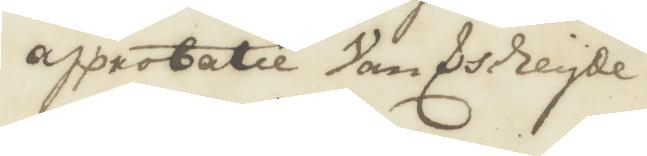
approbatie van verscheijde
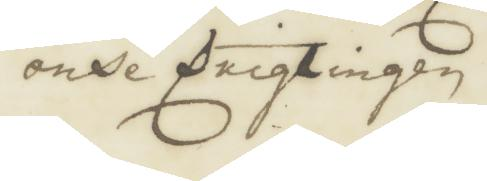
onse verrigtingen
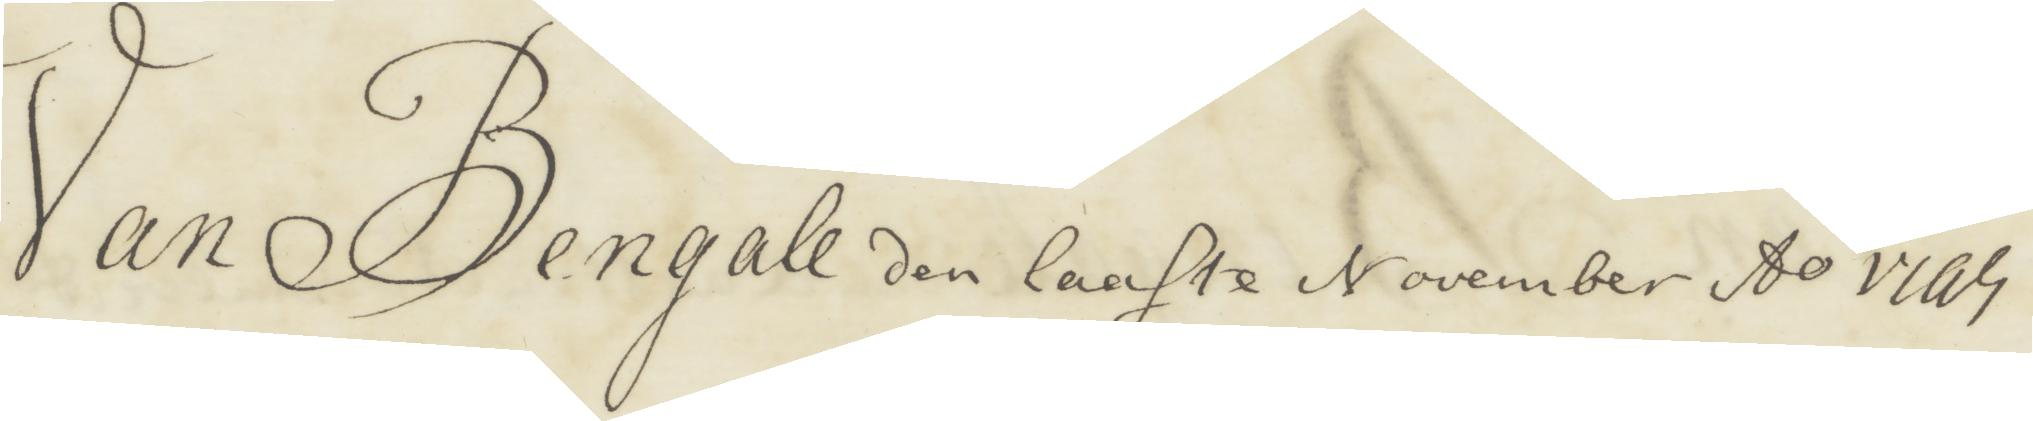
Van Bengale den laaste November Ao 1747
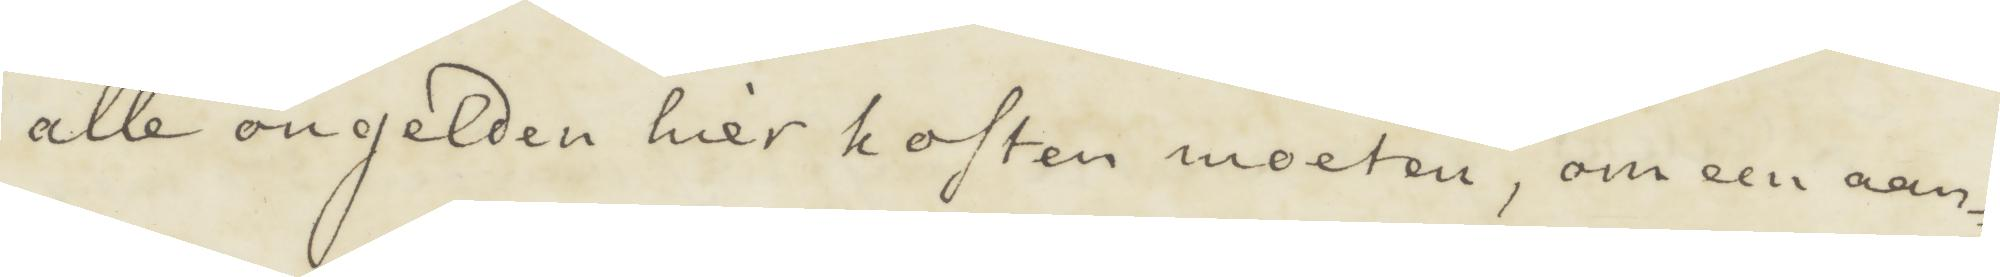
alle ongelden hier kosten moeten, om een aan=
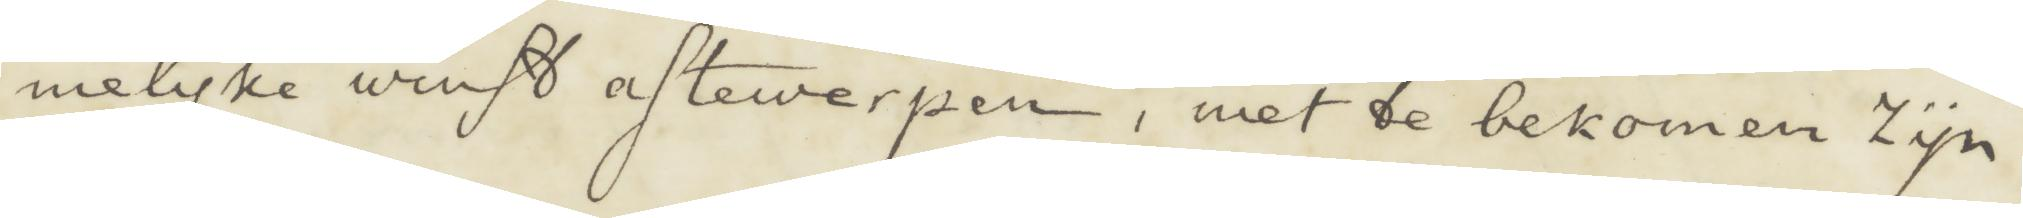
melyke winst aftewerpen, niet te bekomen zijn
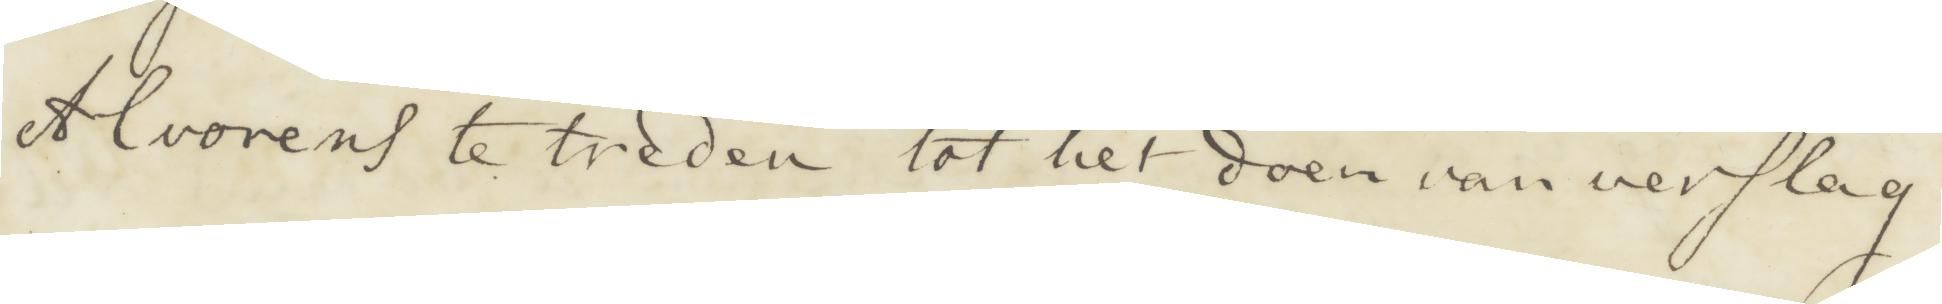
Alvorens te treden tot het doen van verslag
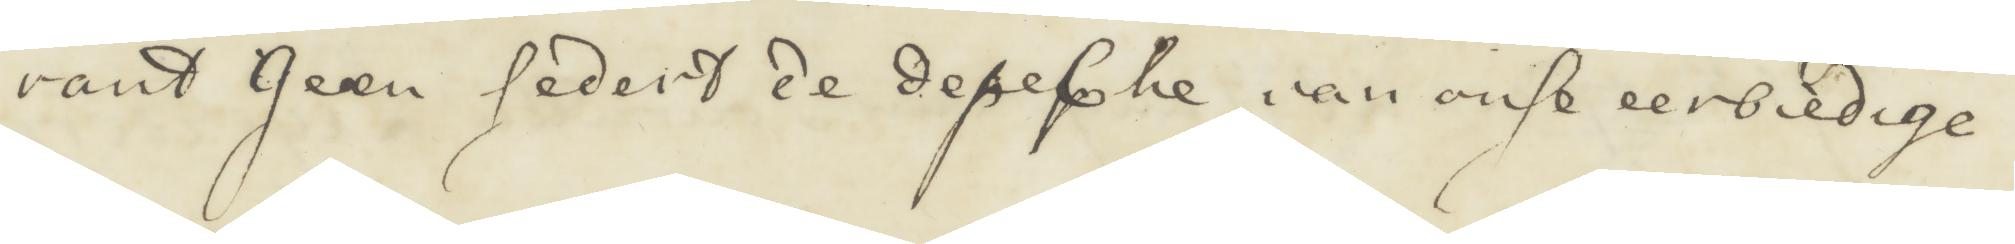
vant geen sedert de depeche van onse eerbiedige
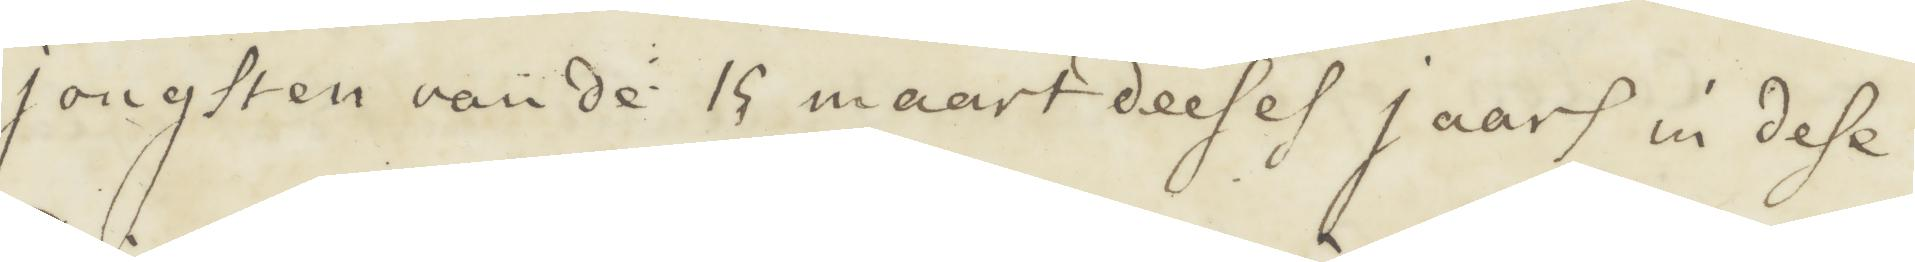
jongsten van de 15 maart deeses jaars in dese
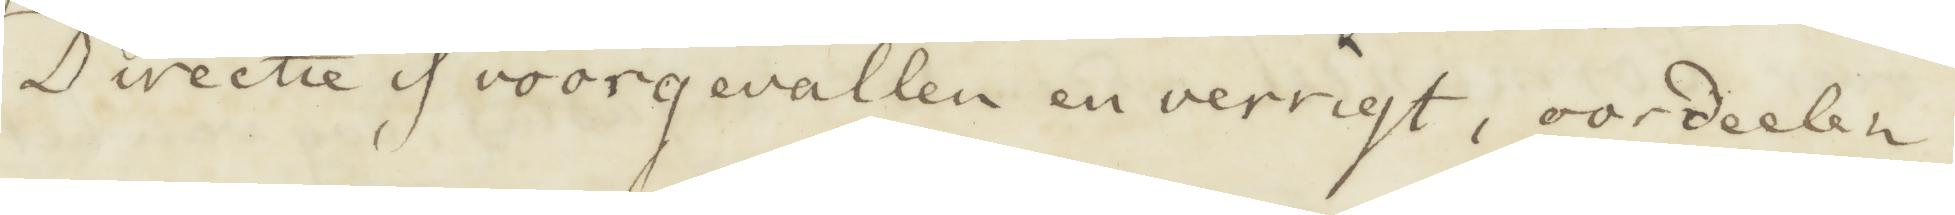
Directie is voorgevallen en verrigt, oordeelen
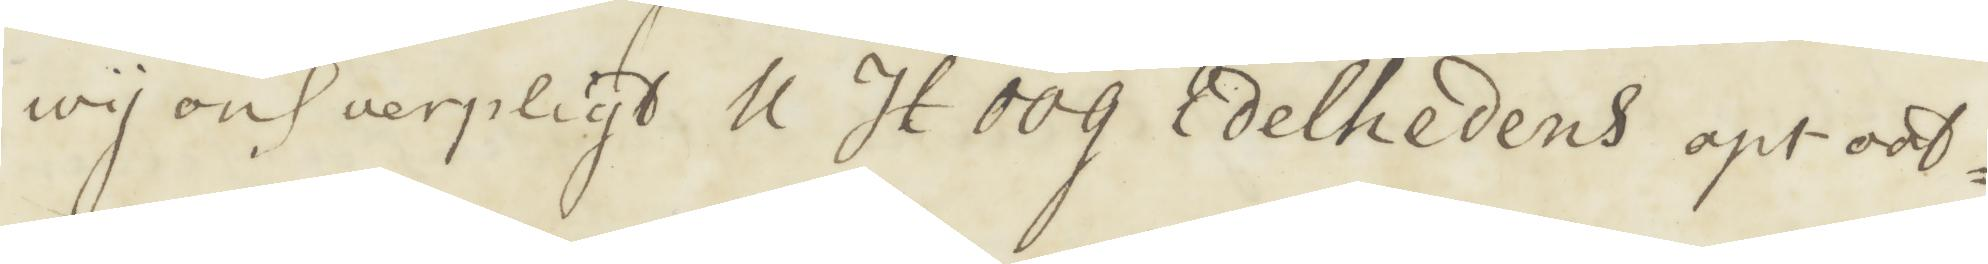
wij ons verpligd U Hoog Edelhedens opt ood=
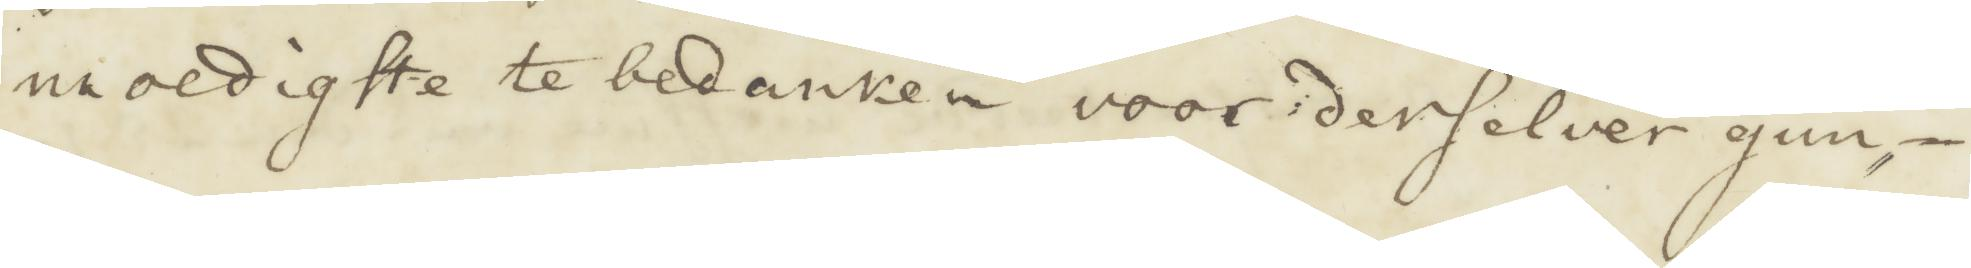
moedigste te bedanken voor derselver gun„
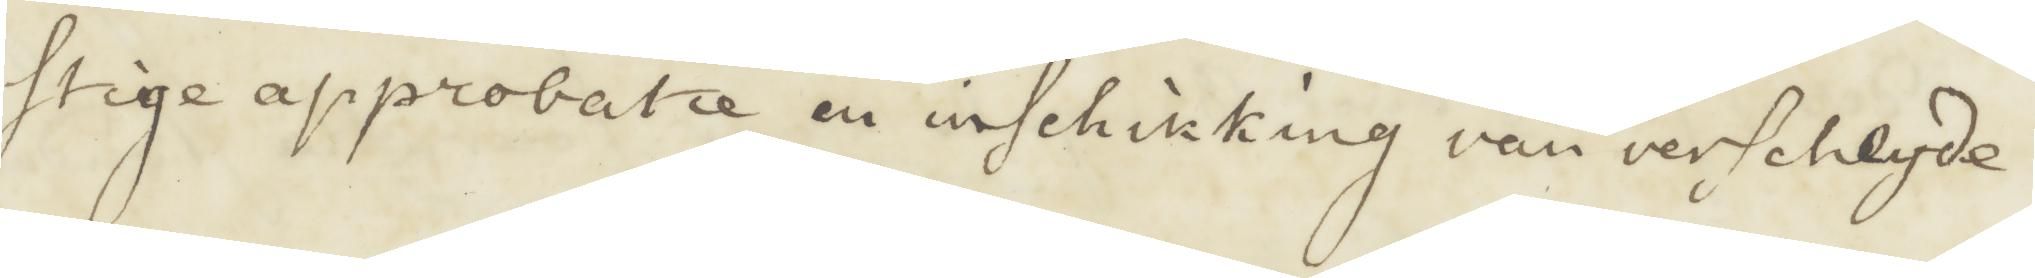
stige approbatie en inschikking van verscheyde
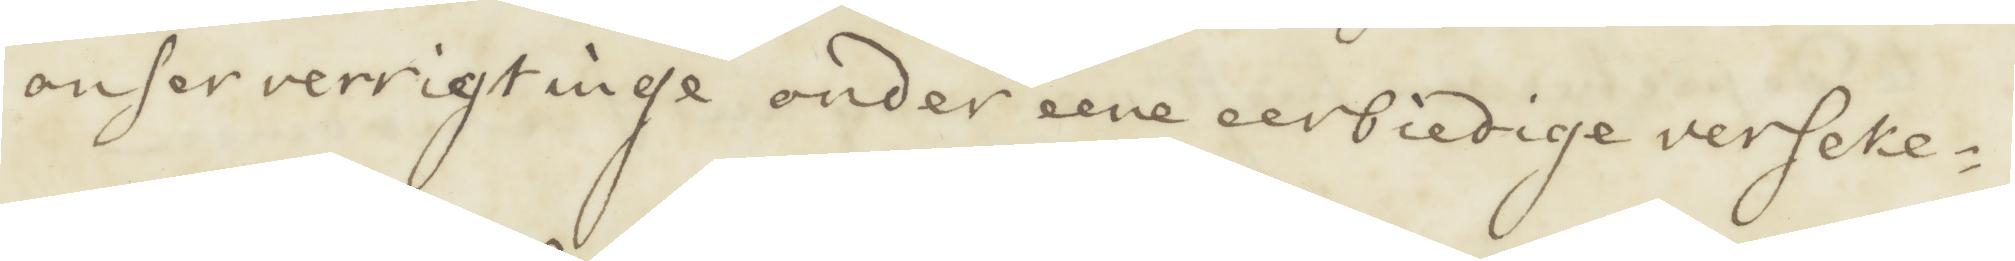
onser verrigtinge onder eene eerbiedige verseke=
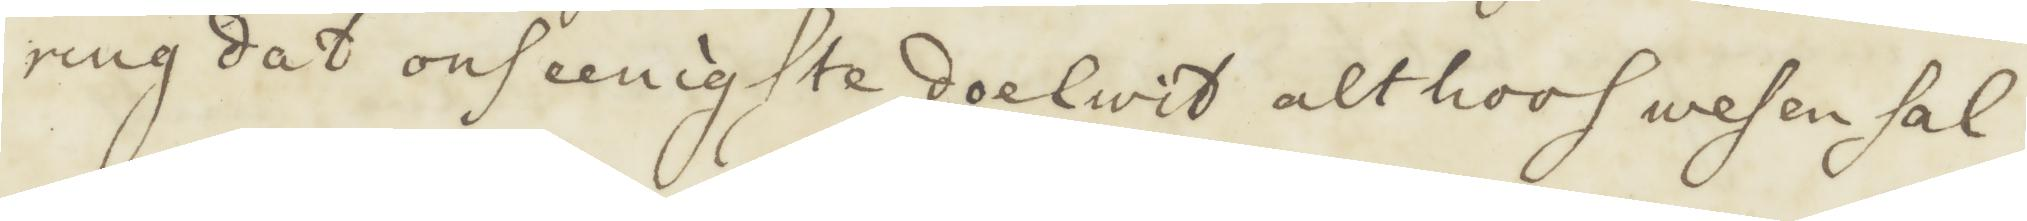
ring dat ons eenigste doelwit althoos wesen sal
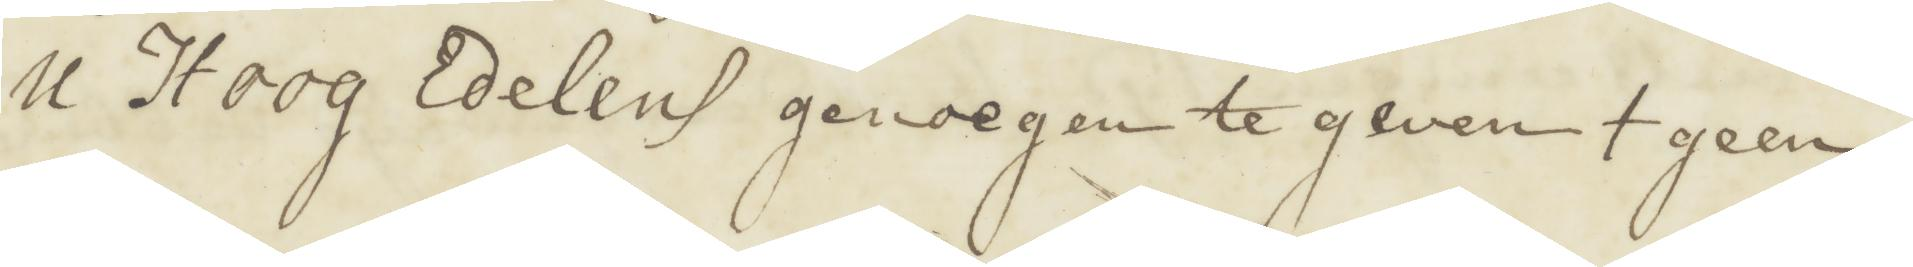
u Hoog Edelens genoegen te geven t geen
